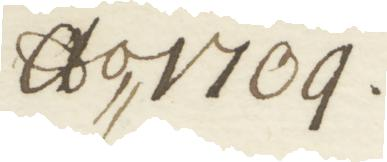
A„o 1704.
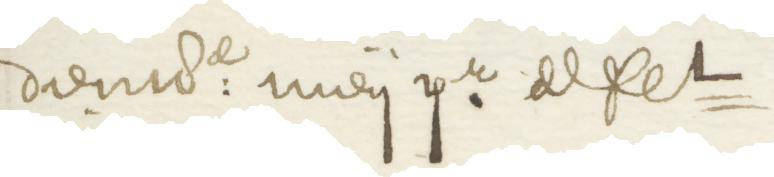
den 18:e meij p.r elflt=
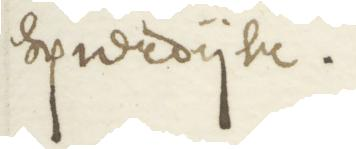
spierdijk.
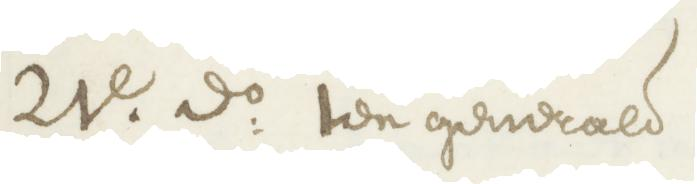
21e. d:o ten generale
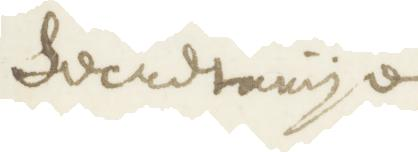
Secretarije
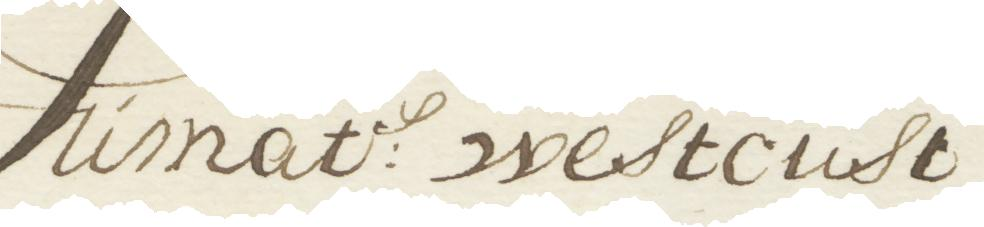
Sumat:s westcust
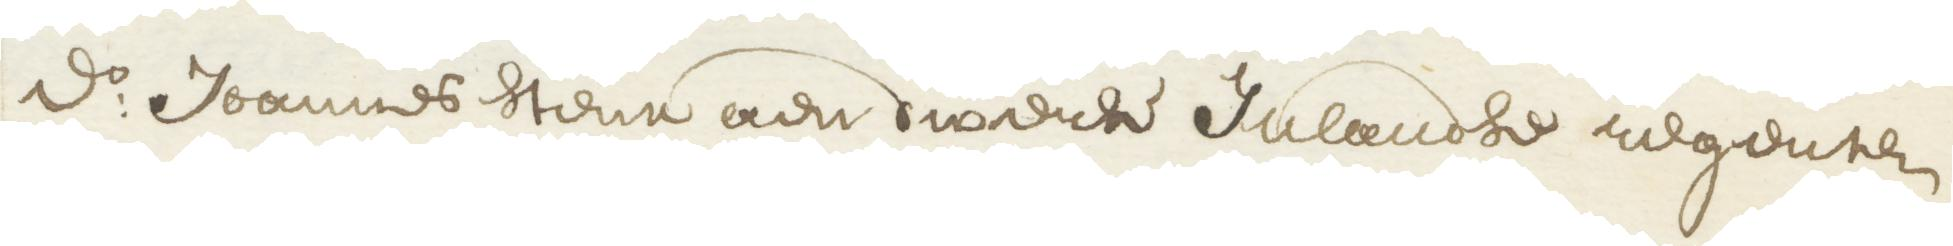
D:o Ioannes steur aen diverse Inlandse regenten
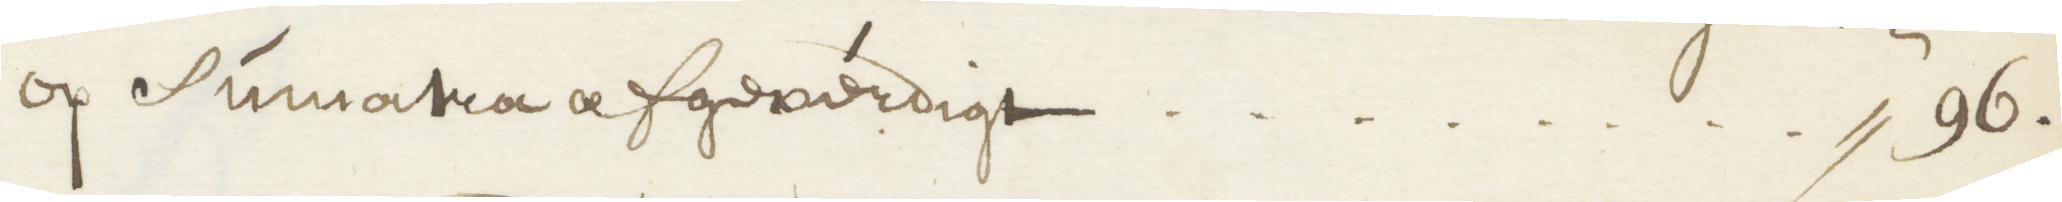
op Sumatra afgeverdigt - - - - - - - - „96.
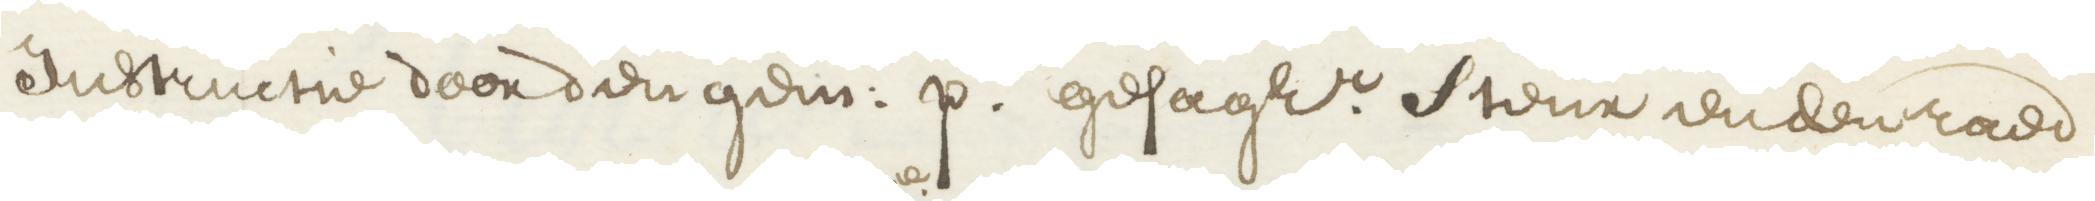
Instructie door den gem: p.e gesagh.r steur en den raed
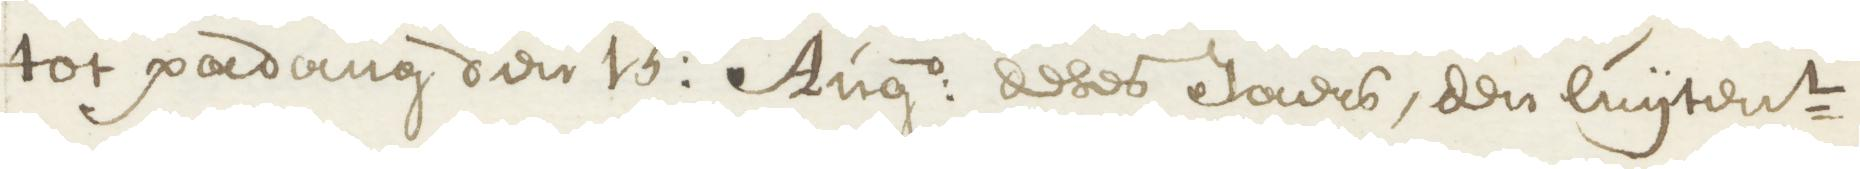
tot padang den 15:e Augo: deses Iaers, den luijten=t
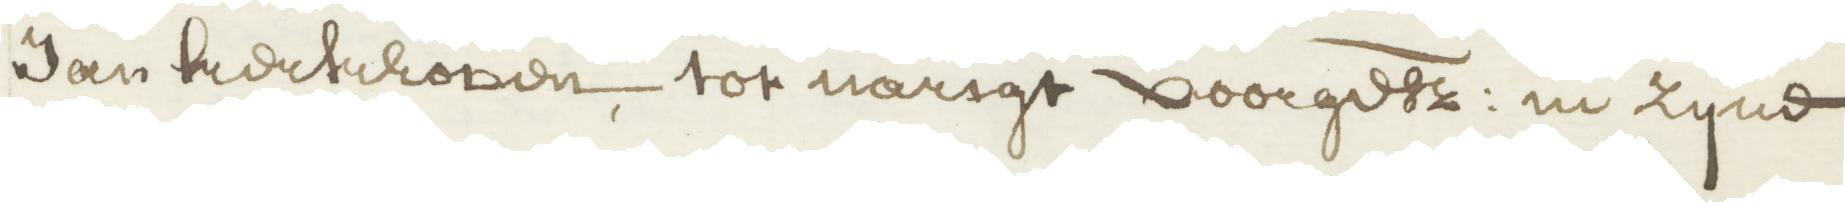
Ian kerkhoven, tot narigt voorgesz: in zijne
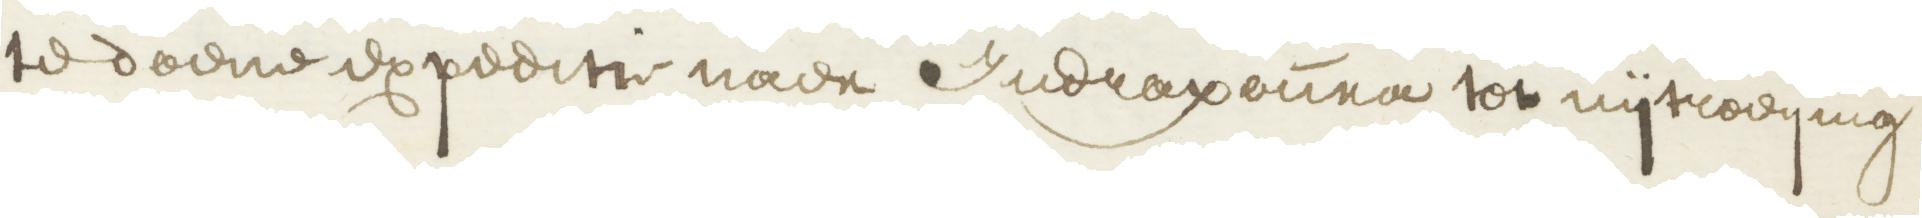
te doene expeditie naer Indrapoura tot uijtroeijing
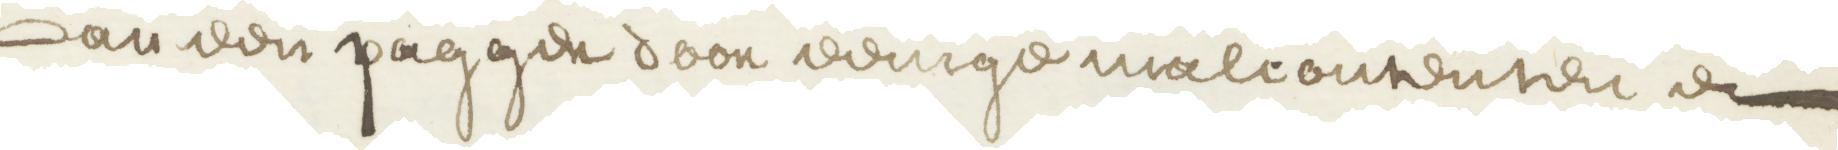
van een pagger door eenige malcontenten en
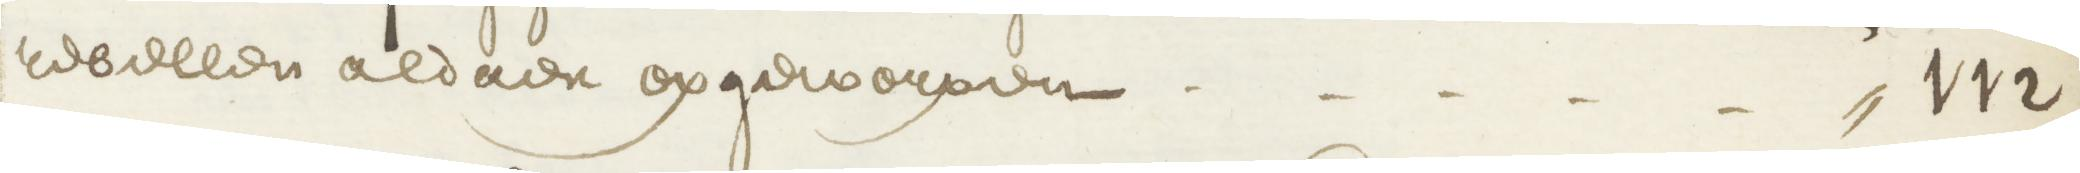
rebellen aldaer opgeworpen - - - - - „112
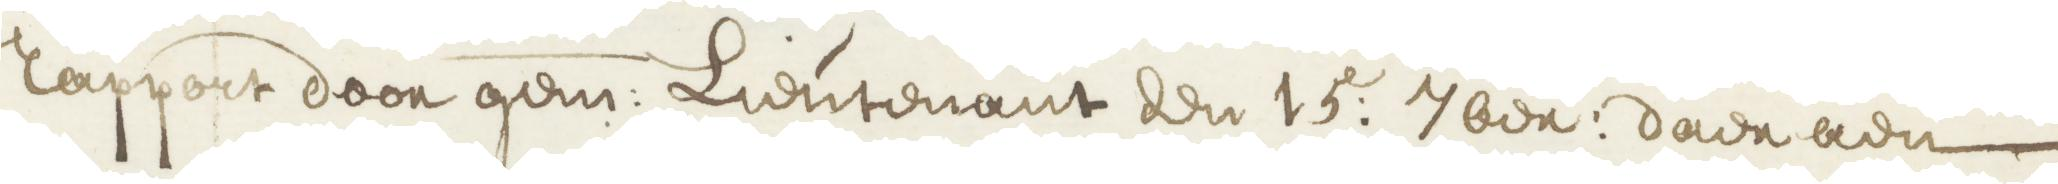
rapport door gem: Lieutenant den 15: 7ber: daer aen
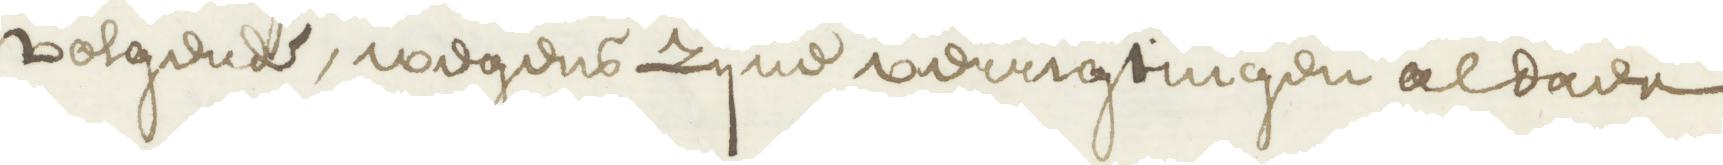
volgende, wegens zijne verrigtingen aldaer
